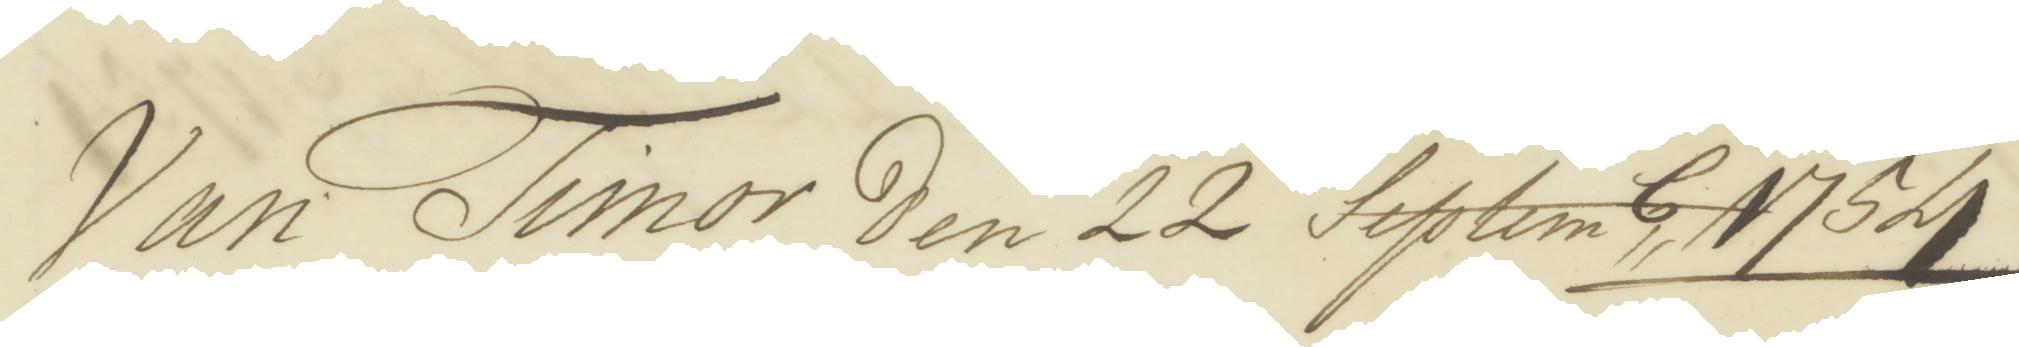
Van Timor den 22 Septemb„ 1754
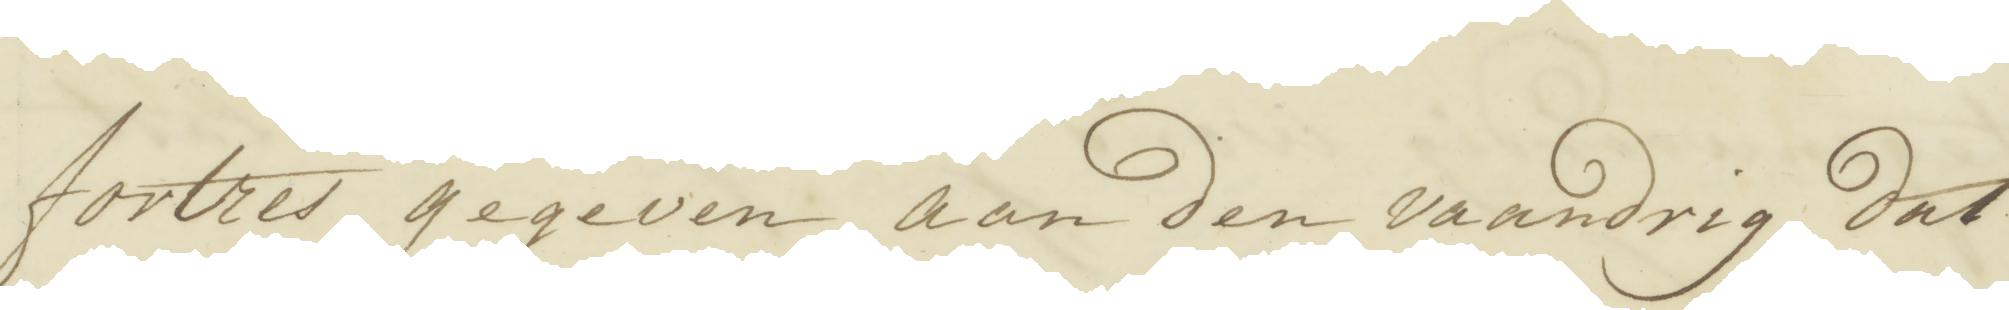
fortres gegeven, aan den vaandrig, dat
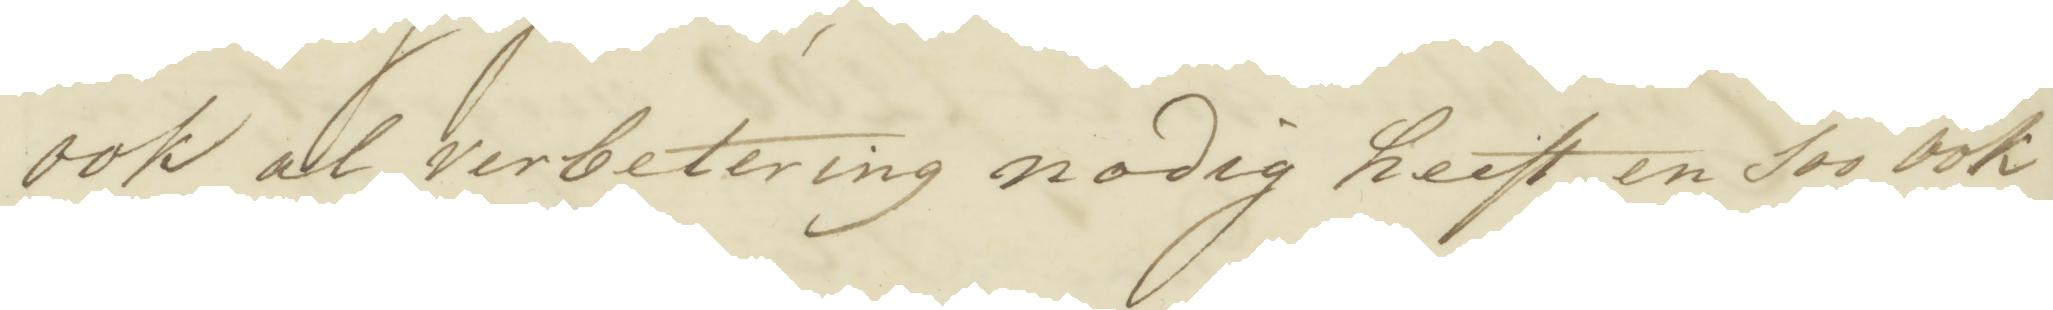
ook al verbetering nodig heeft, en soo ook
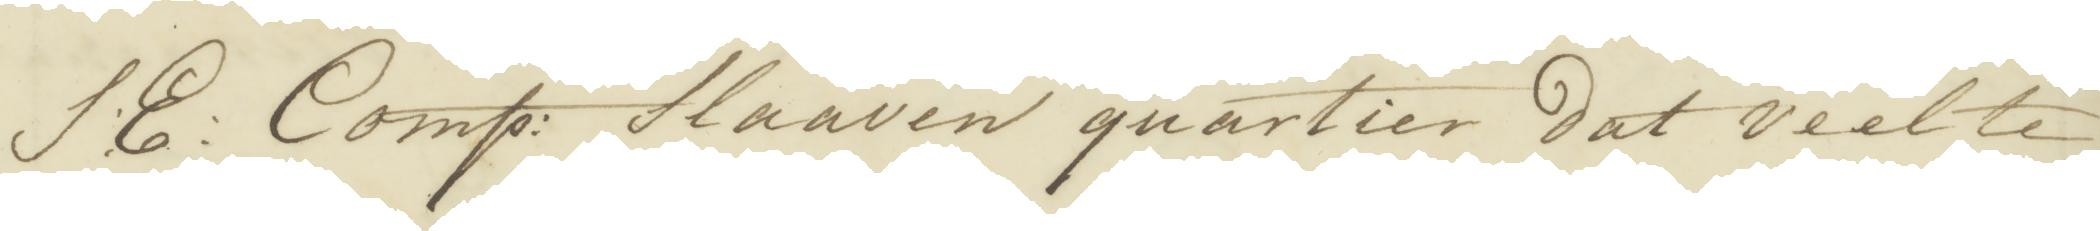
s: E: Comp: slaaven quartier dat veel te
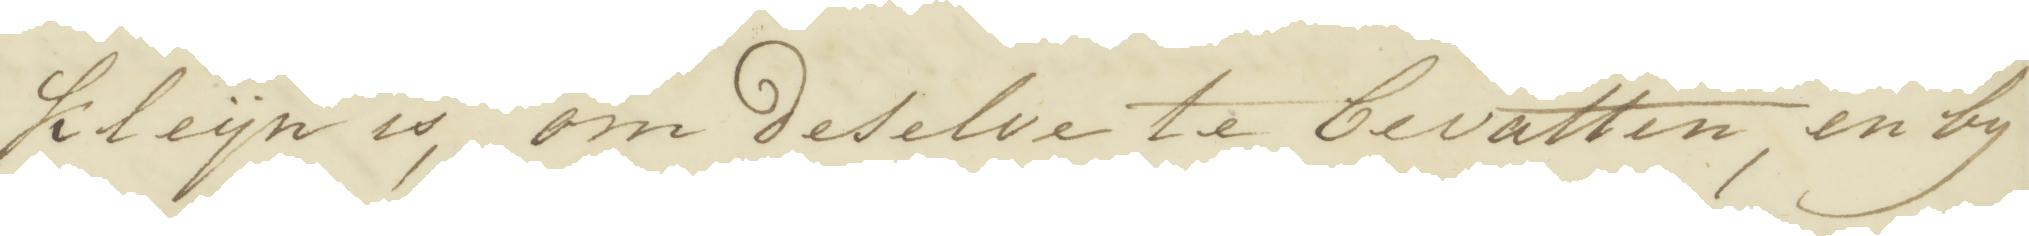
kleijn is, om deselve te bevatten, en bij
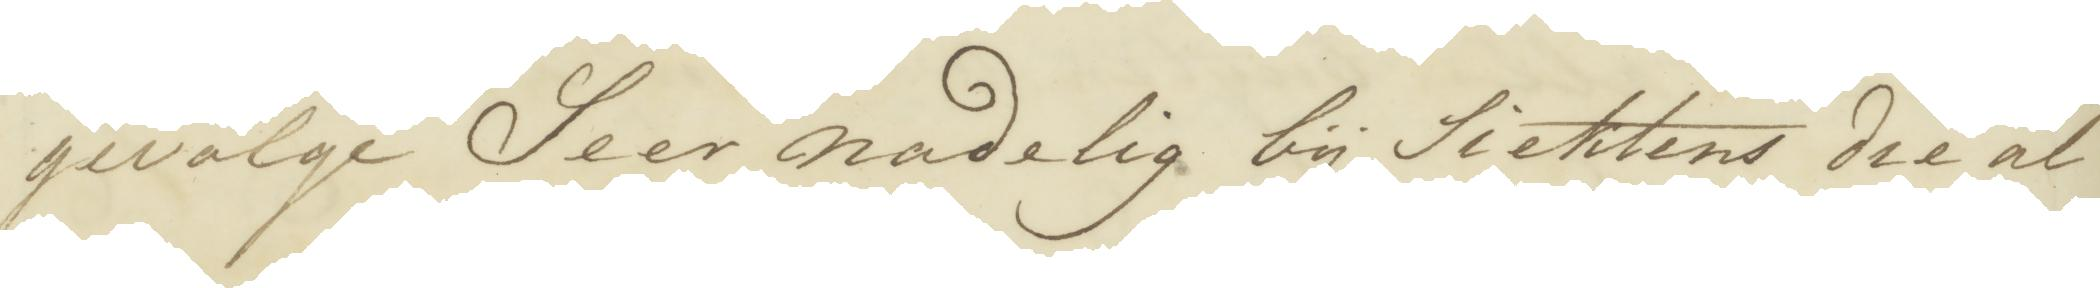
gevolge seer nadelig bij siektens die al
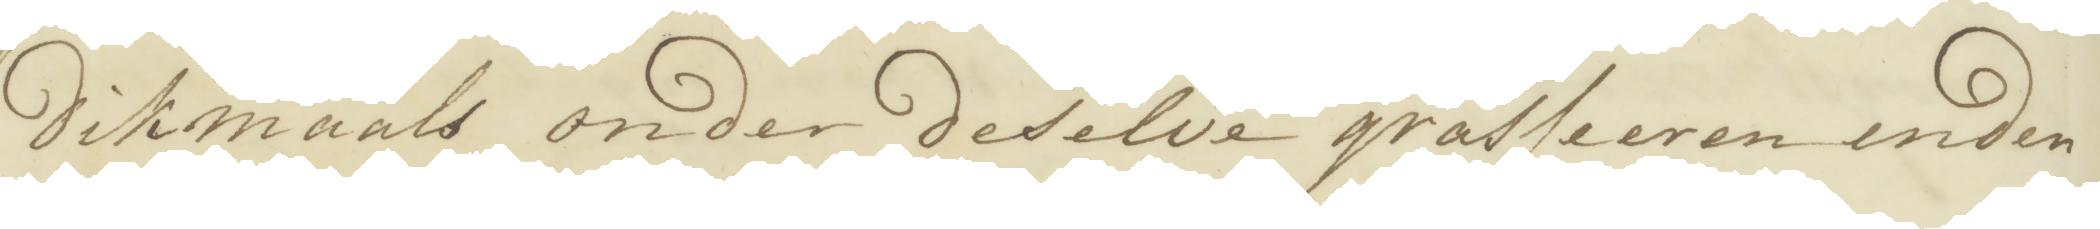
dikmaals onder deselve grasseeren enden
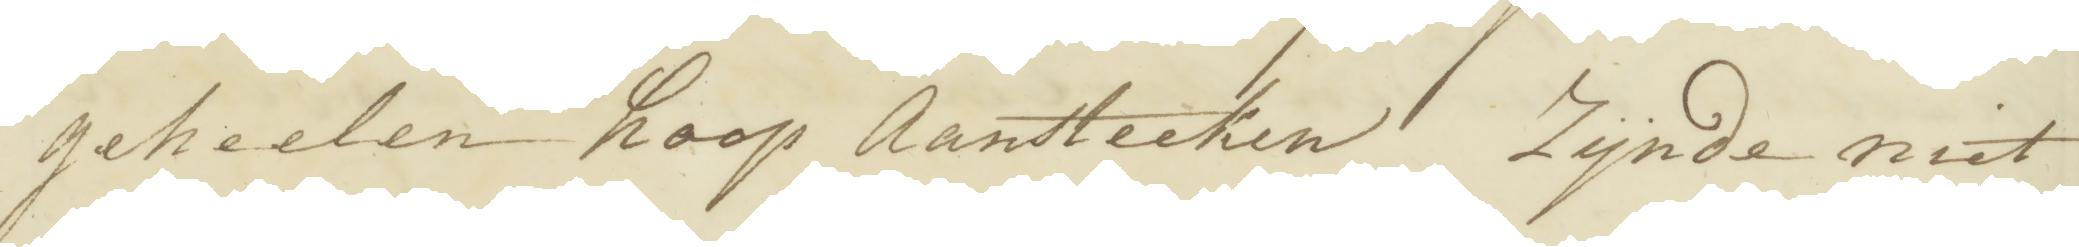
geheelen hoop Aansteeken, zijnde niet
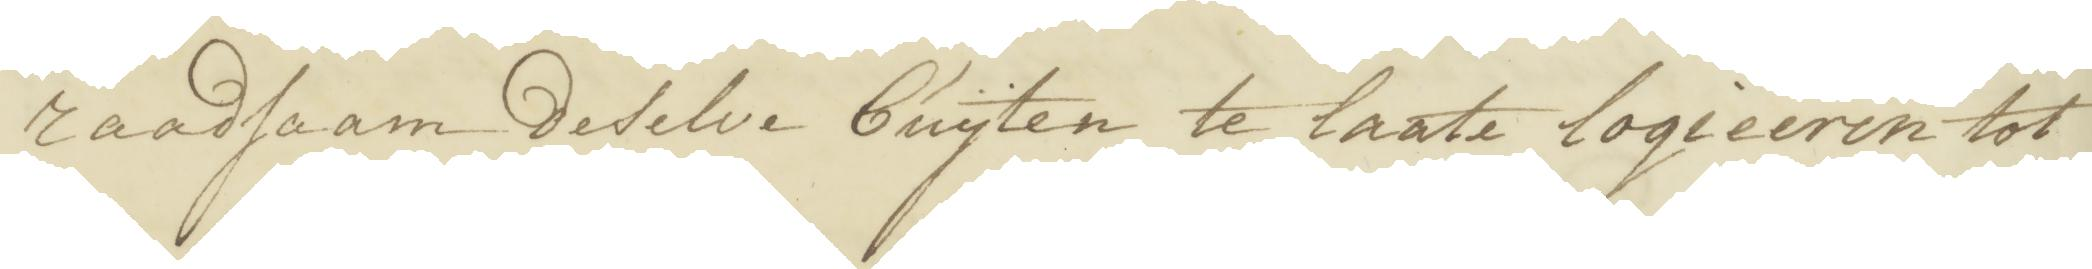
raadsaam deselve buijten te laate logieeren tot
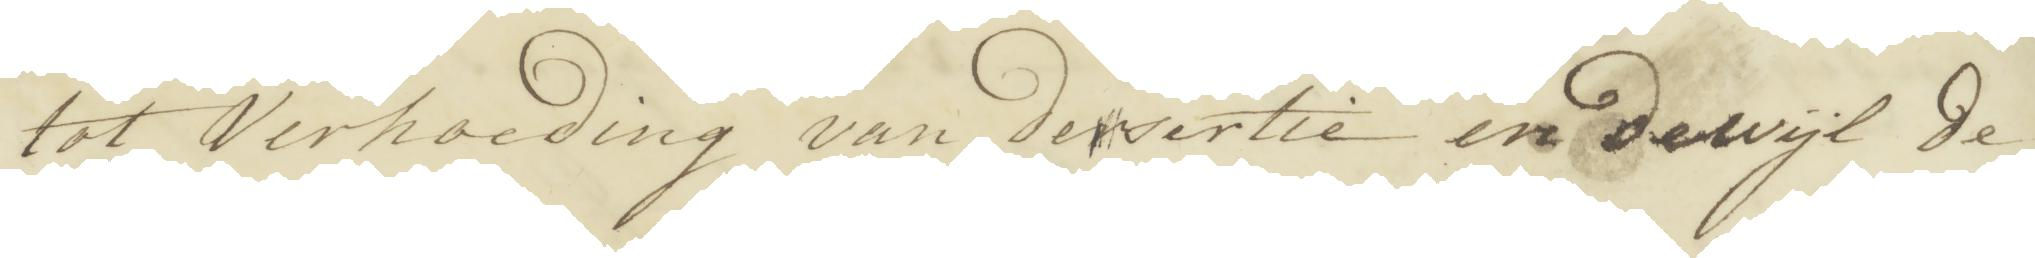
tot verhoeding van dersertie en dewijl de
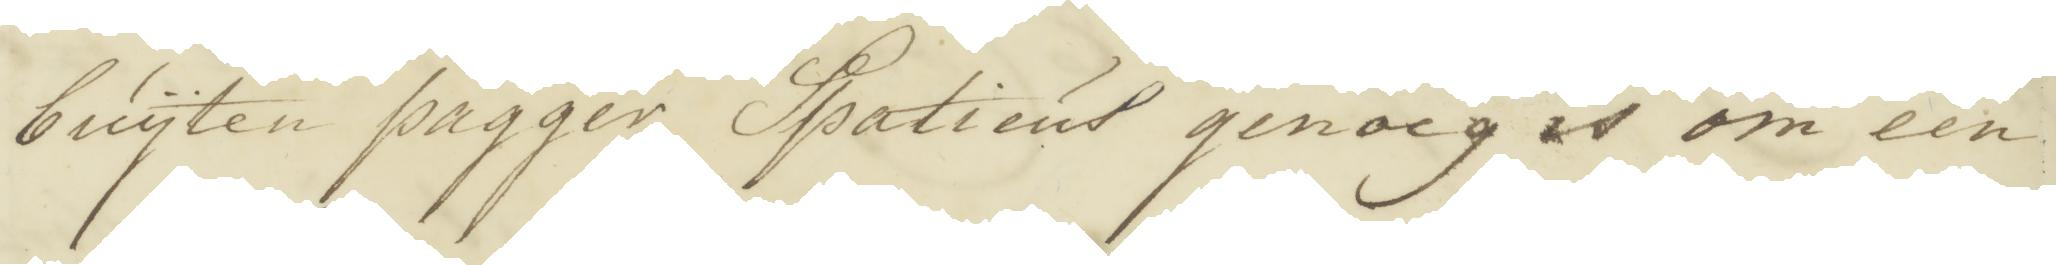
buijten pagger spatieus genoeg is om een
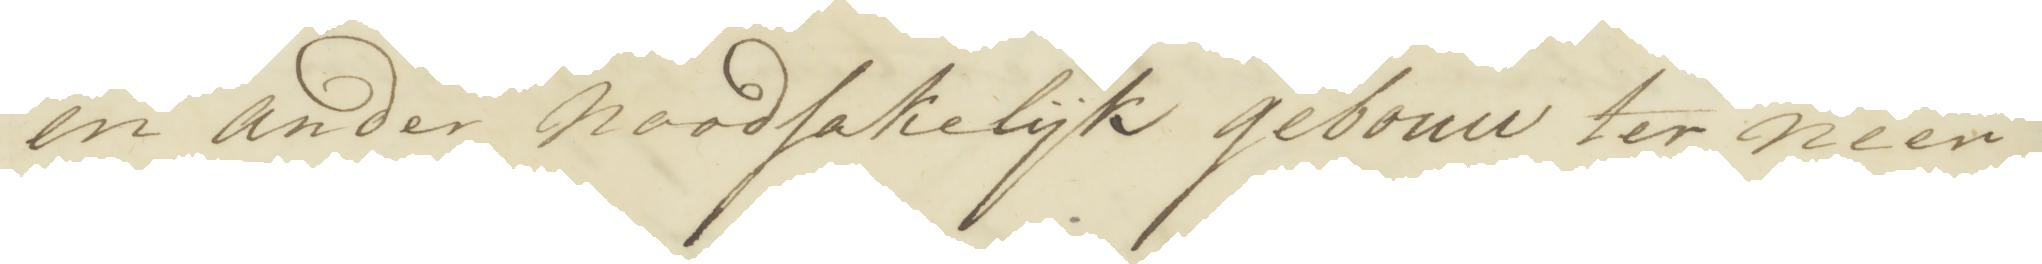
en ander noodsakelijk gebouw ter neer
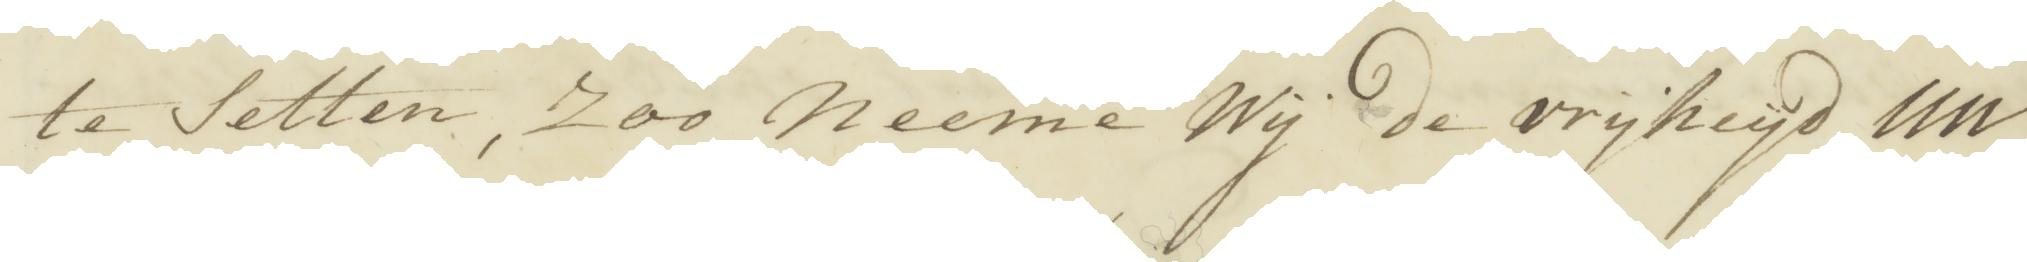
te setten, zoo neeme wij de vrijheijd uw
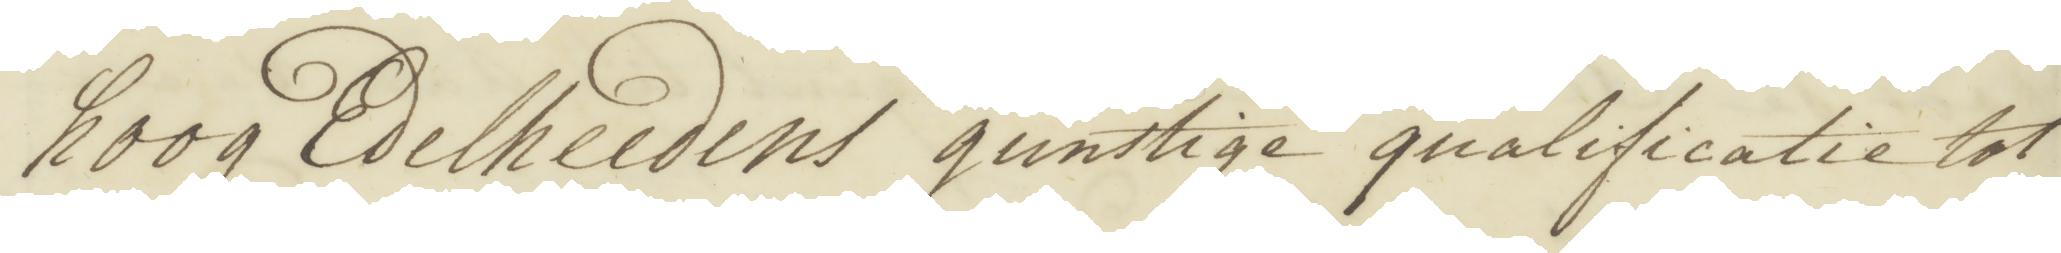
hoog Edelheedens gunstige qualificatie tot
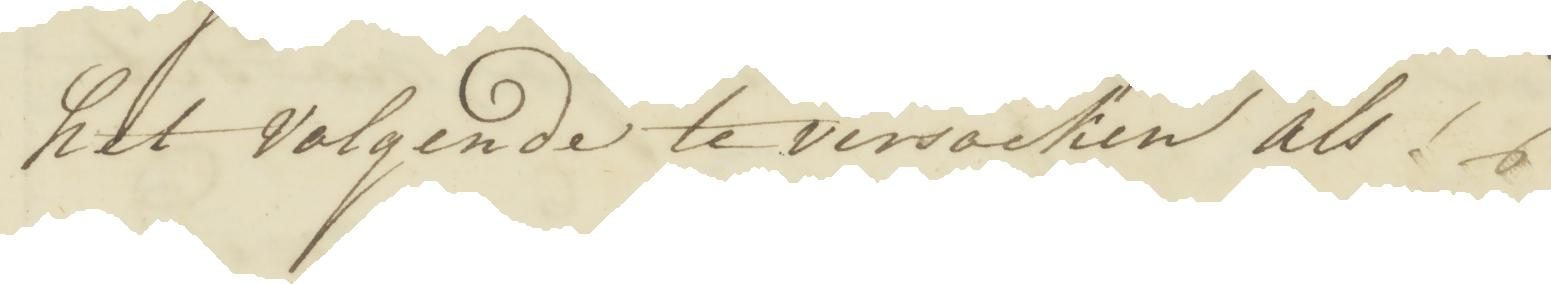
het volgende te versoeken als!
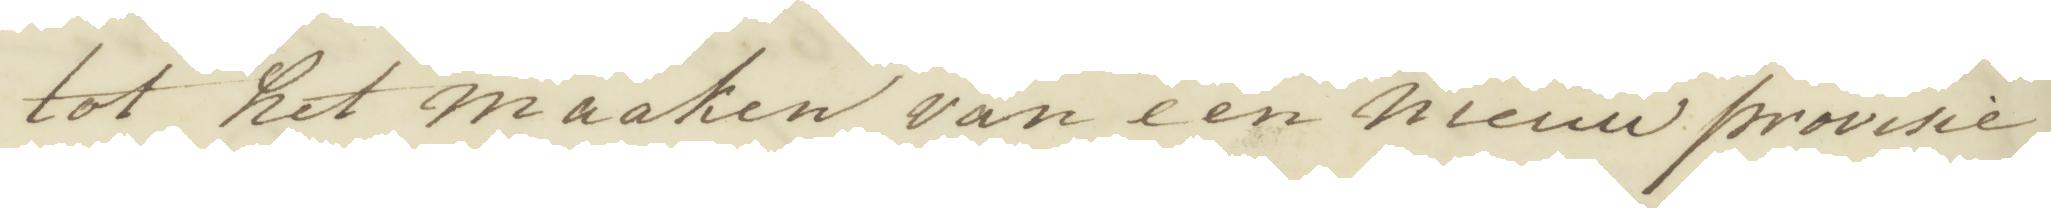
tot het maaken van een nieuw provisie
